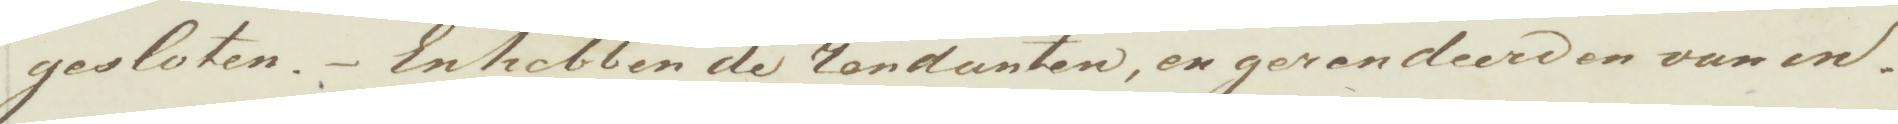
gesloten. – En hebben de rendanten, en gerendeerden van in-
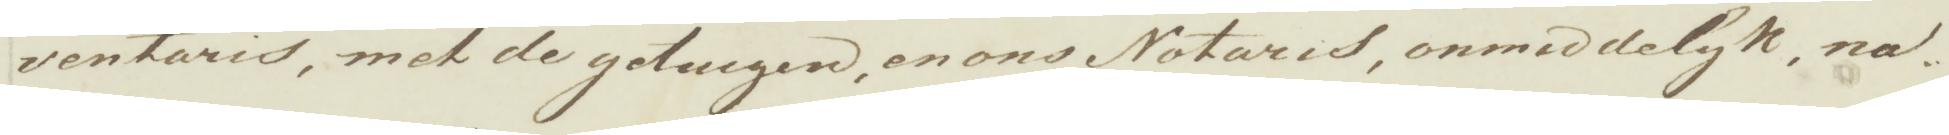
ventaris, met de getuigen, en ons Notaris, onmiddelyk, na„
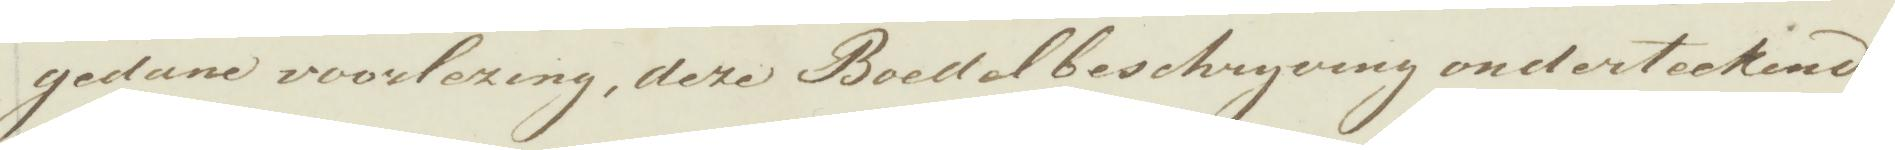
gedane voorlezing, deze Boedelbeschryving onderteekend,
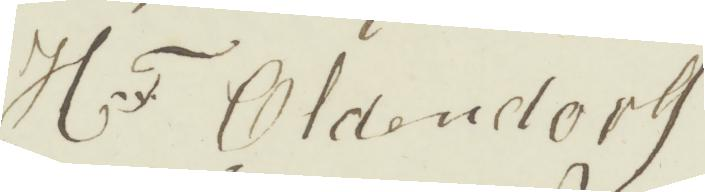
H F Oldendorff
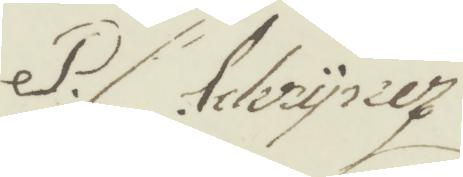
P. C. Schrijner
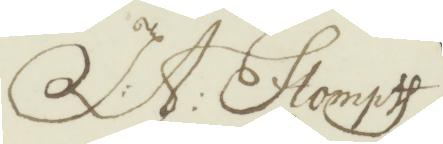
J: A: Stompff
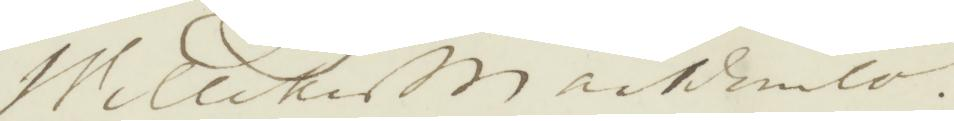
Willeke Machemlo
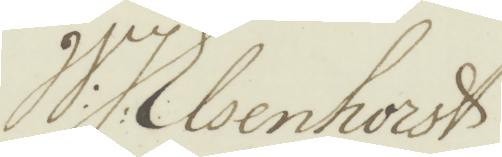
W:J: Elsenhorst
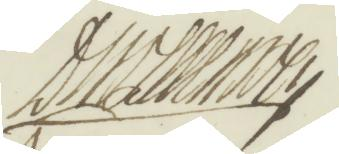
DW Swenris
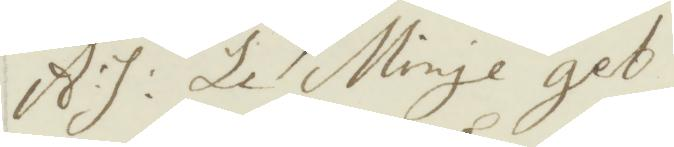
A: J: Le Minje geb
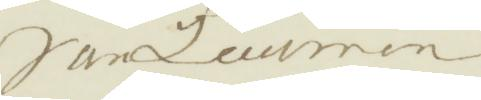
Van Leeuwen
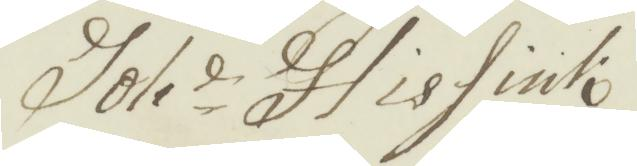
Joh=e Hissink
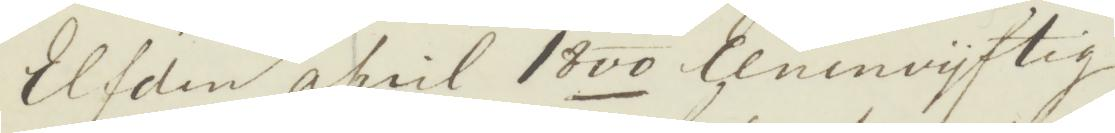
Elfden april 1800 Eenenvijftig
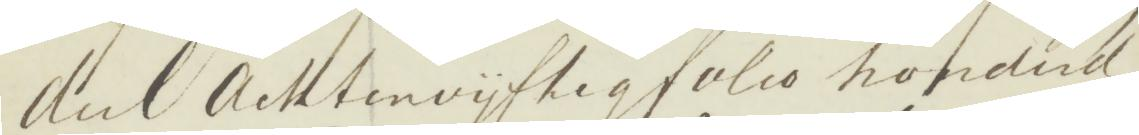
deel Achtenvijftig folio honderd
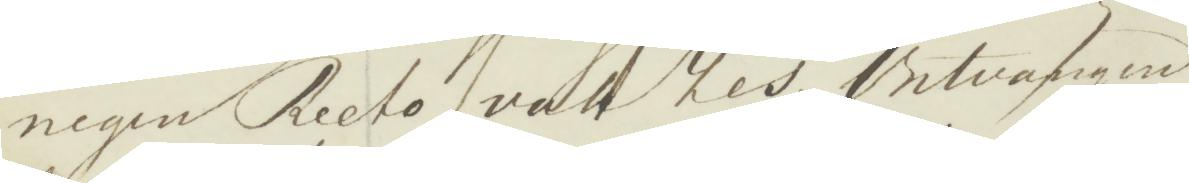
negen Recto vak Zes. Ontvangen
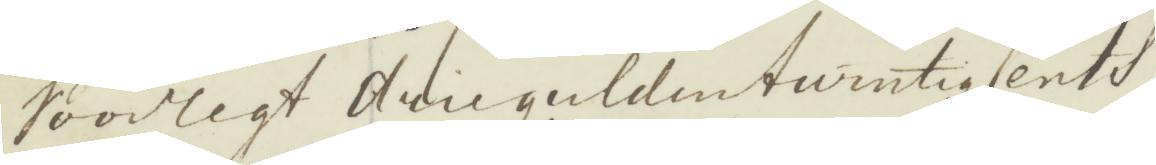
Voor regt drie gulden twintig Cents
